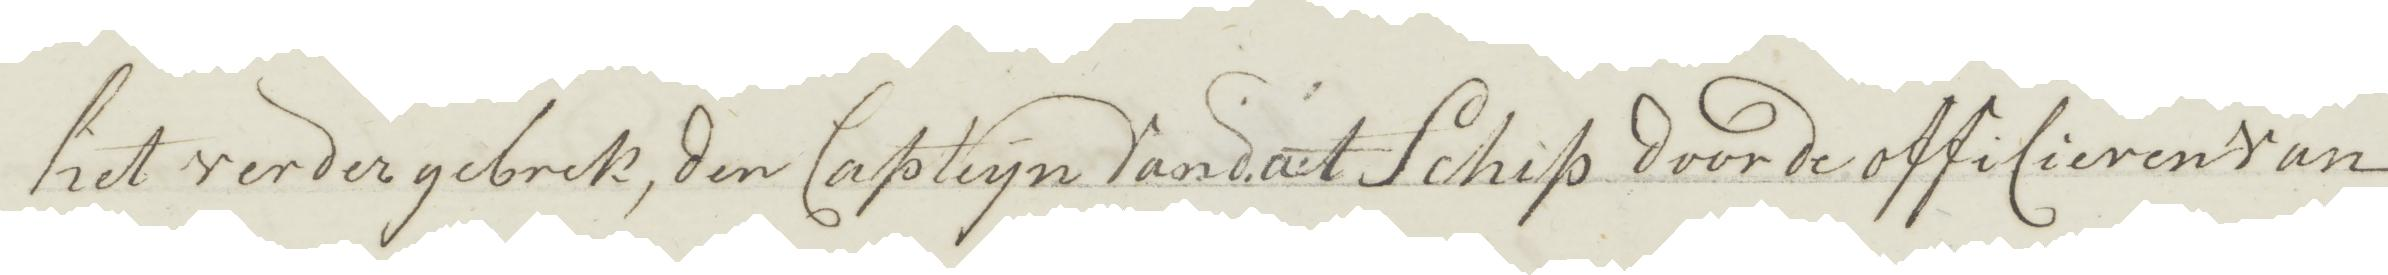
het verder gebrek, den Capteijn van dat Schip door de officieren van
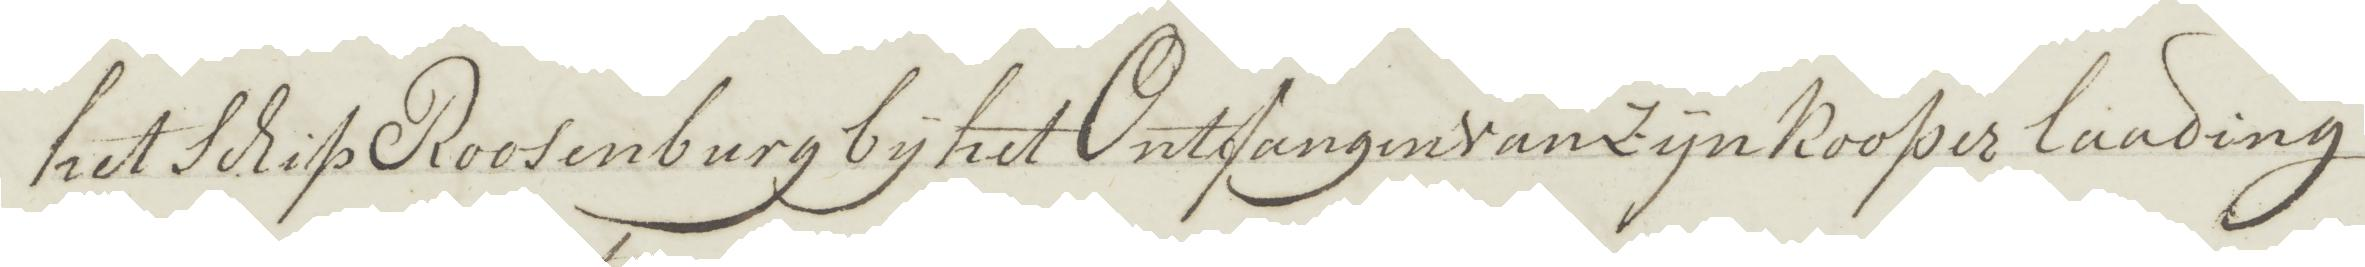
het Schip Roosenburg bij het Ontfangen van zijn Kooper laading
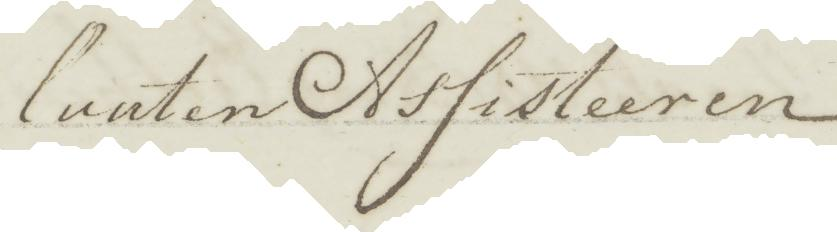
laaten Assisteeren
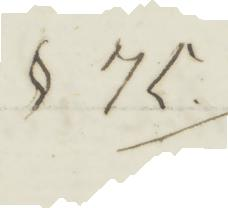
§ 75.
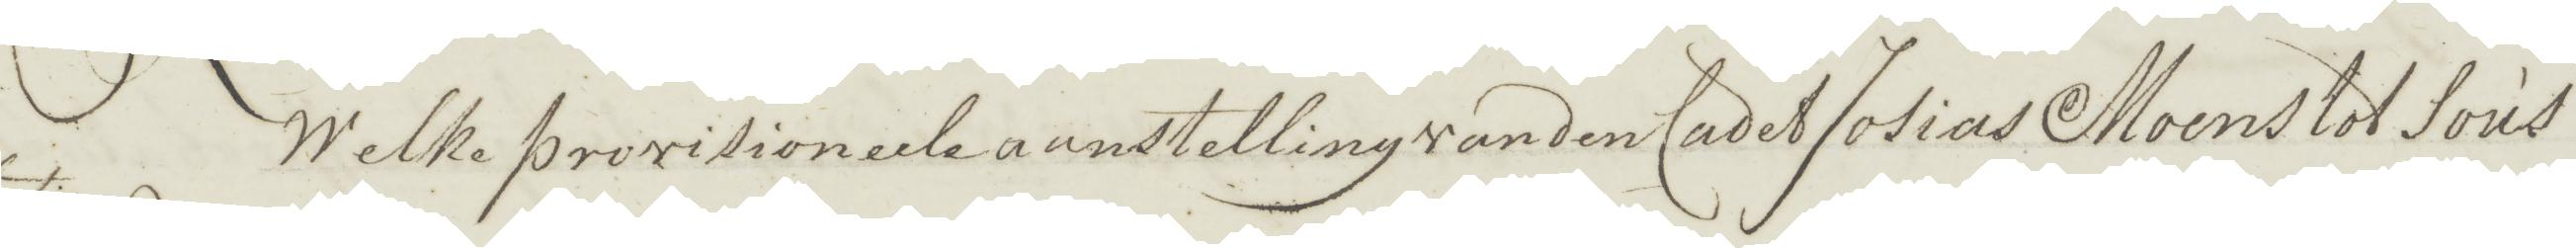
Welke provisioneele aanstelling van den Cadet Josias Moens tot Sous
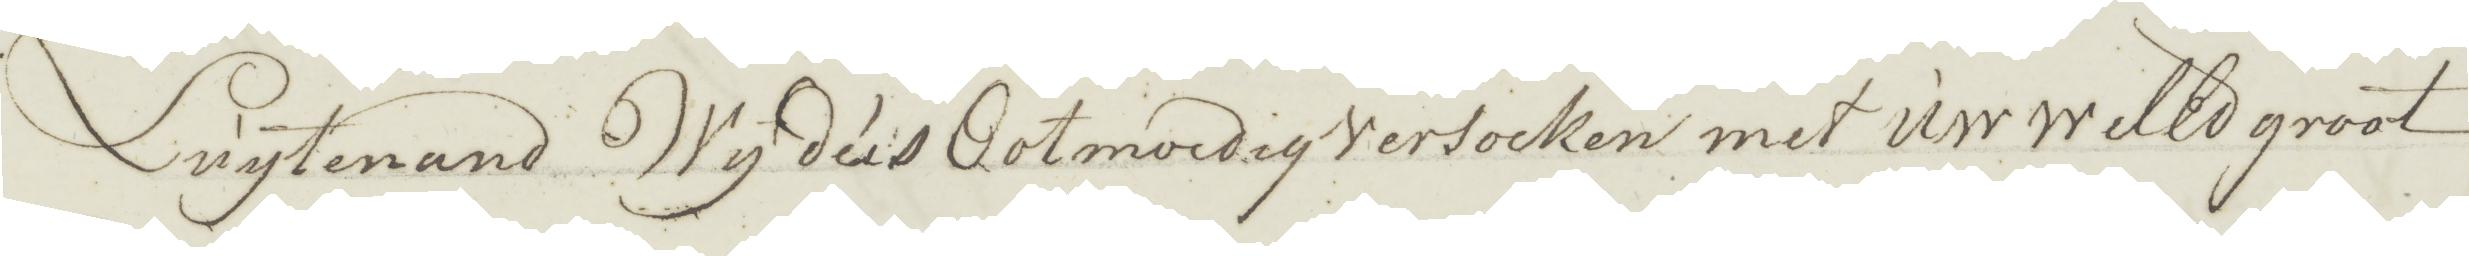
Luijtenand Wij dus Ootmoedig versoeken met uw wel Ed groot
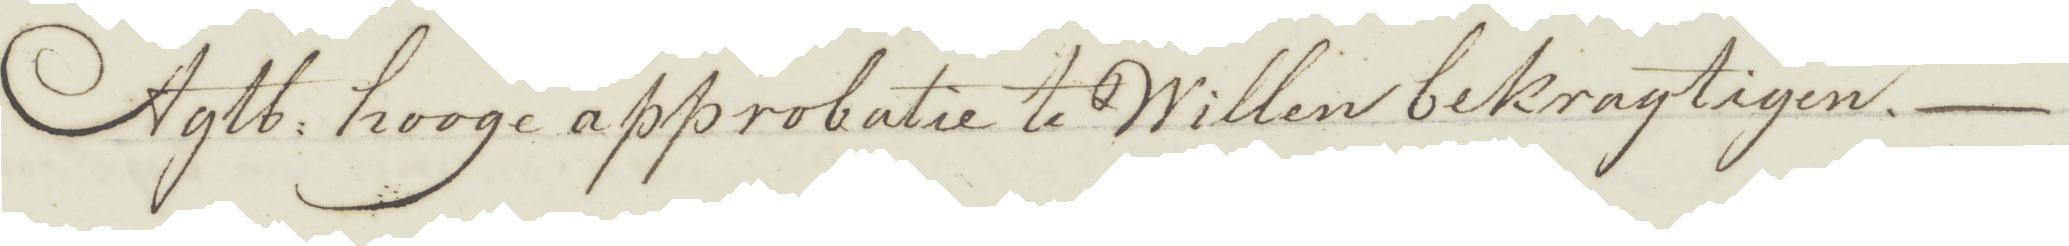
Agtb: hooge approbatie te willen bekragtigen. —
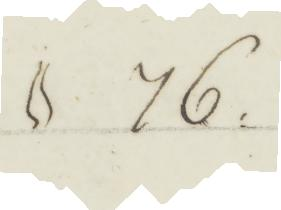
§ 76.
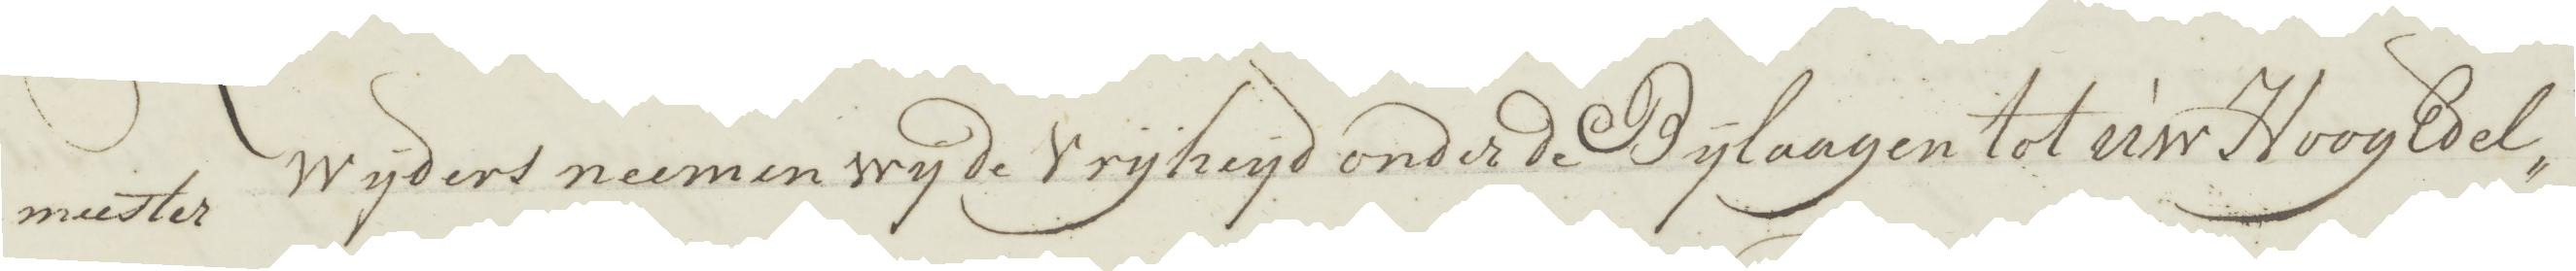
Wijders neemen wij de Vrijheijd onder de Bijlaagen tot uw Hoog Edel„
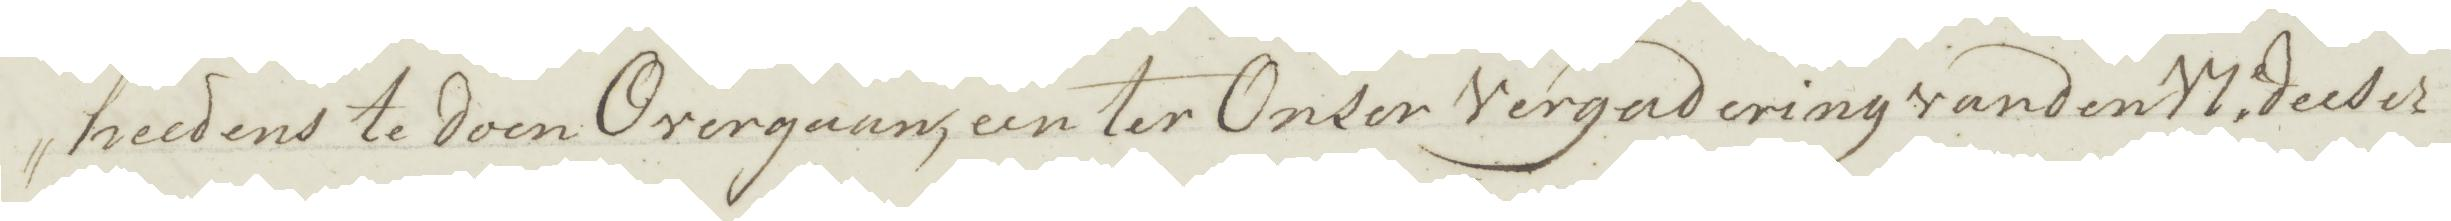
„heedens te doen Overgaan, een ter Onser vergadering van den 17„e deeser
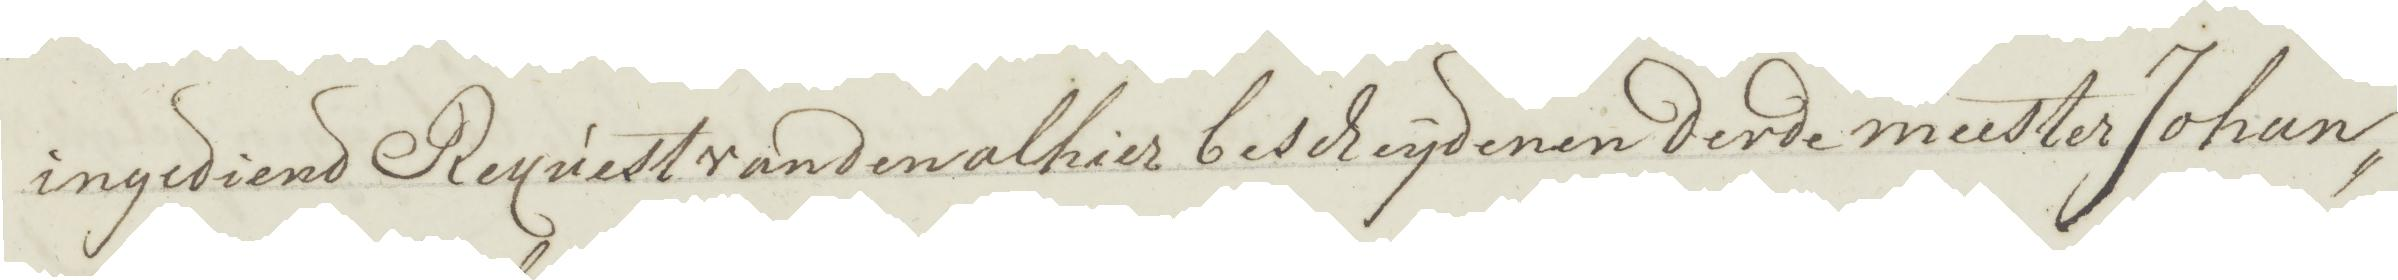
ingediend Request van den alhier bescheijdenen derde meester Johan„
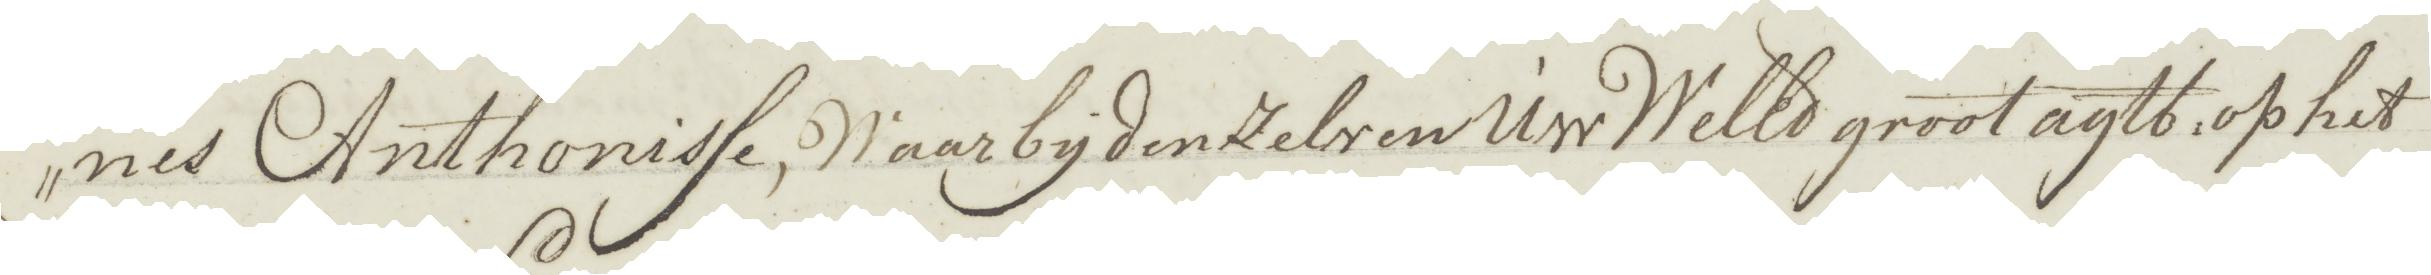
„nes Anthonisse, Waar bij den zelven uw Wel Ed groot agtb: op het
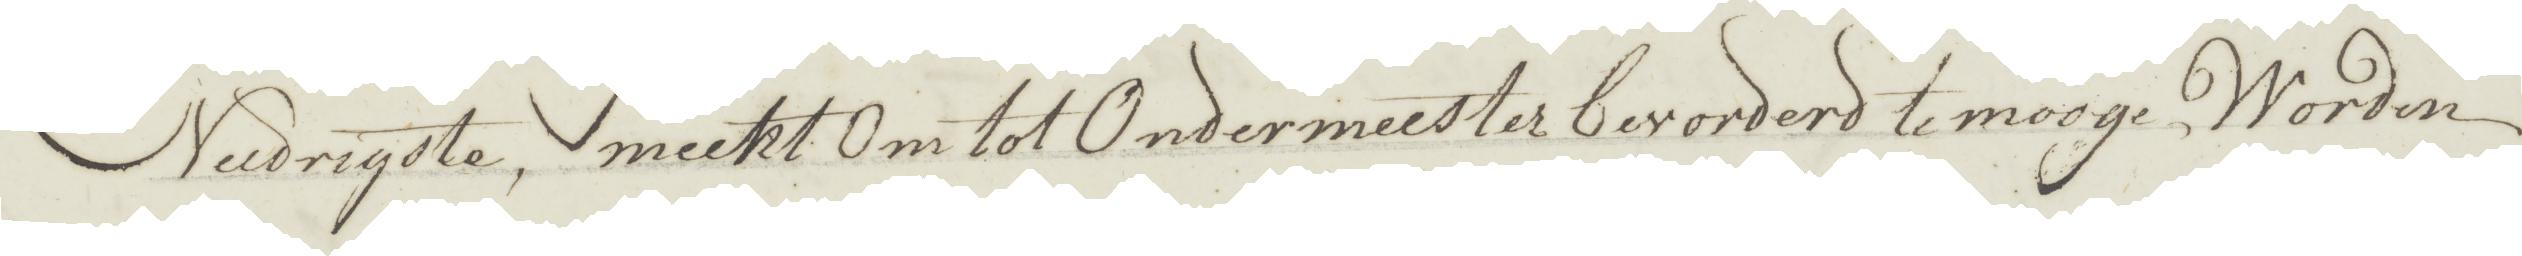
Needrigste, smeekt Om tot Ondermeester bevorderd te mooge Worden
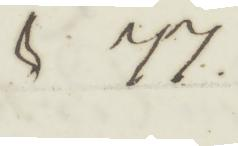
§ 77.
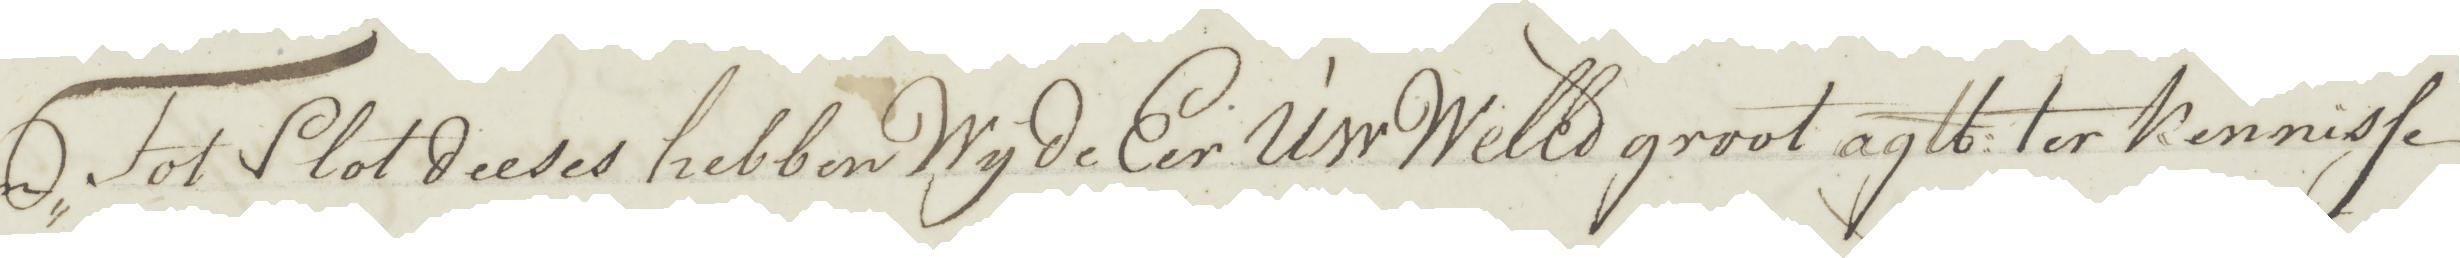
Tot slot deeses hebben Wij de Eer uw Wel Ed groot agtb: ter kennisse
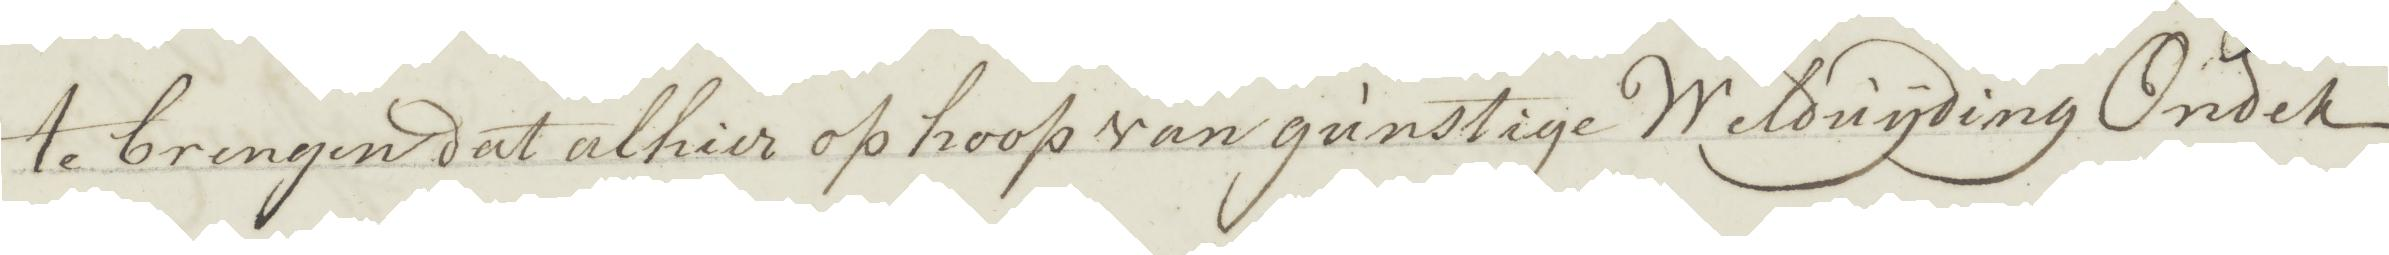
te brengen dat alhier op hoop van gunstige Welduijding Onder
